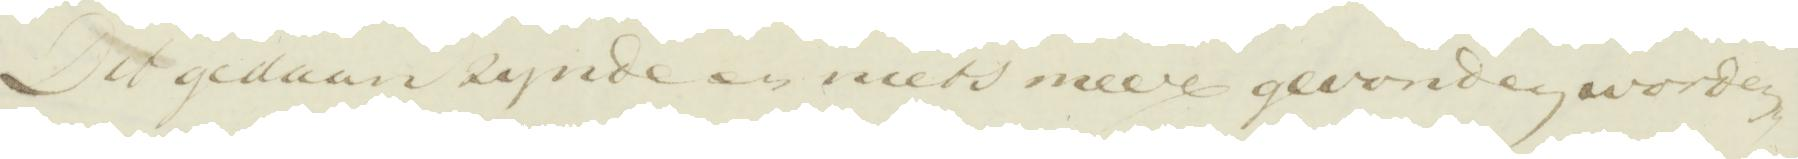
Dit gedaan zynde en niets meer gevonden worden
